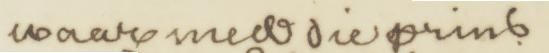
waar mede die prins
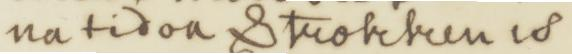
na tidor vertrokken is
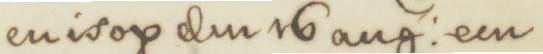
en is op den 16 aug: een
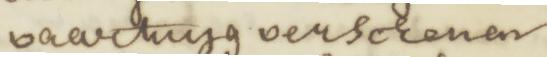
vaartuyg verschenen
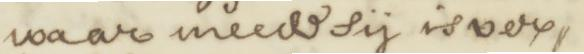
waar meede sij is ver„
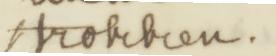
„trokken.
